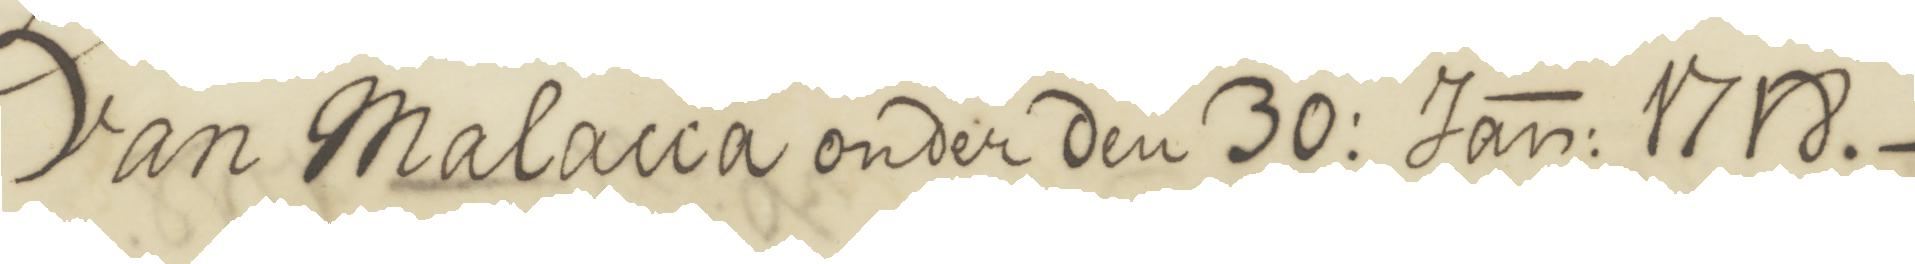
Van Malacca onder den 30: Jan: 1718.
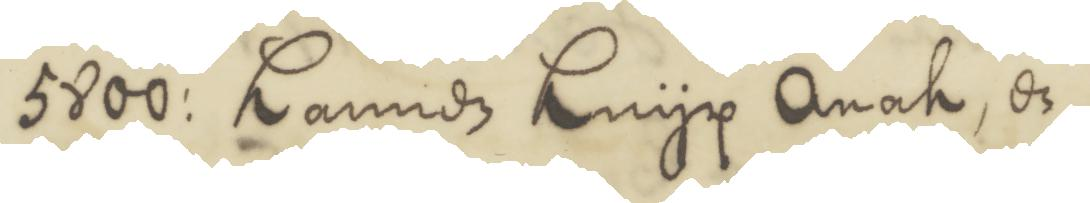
5800: kannen kuijp Arak, en
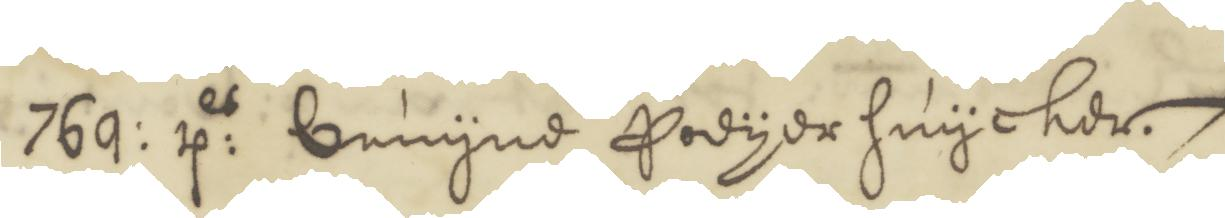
764: p:es bruijne poeijer suijcker.
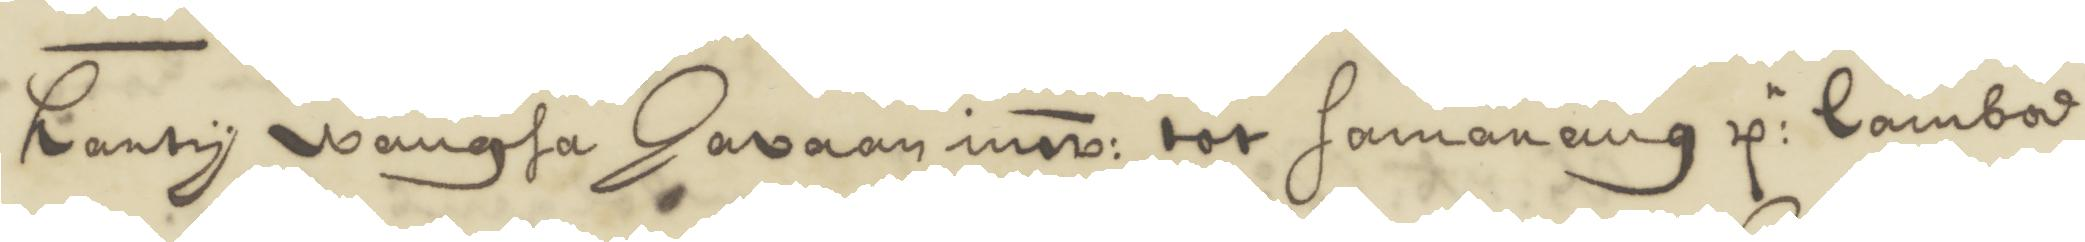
den 26: 8ber: kartij wangsa Javaan inw: tot samarang p:r lamboe
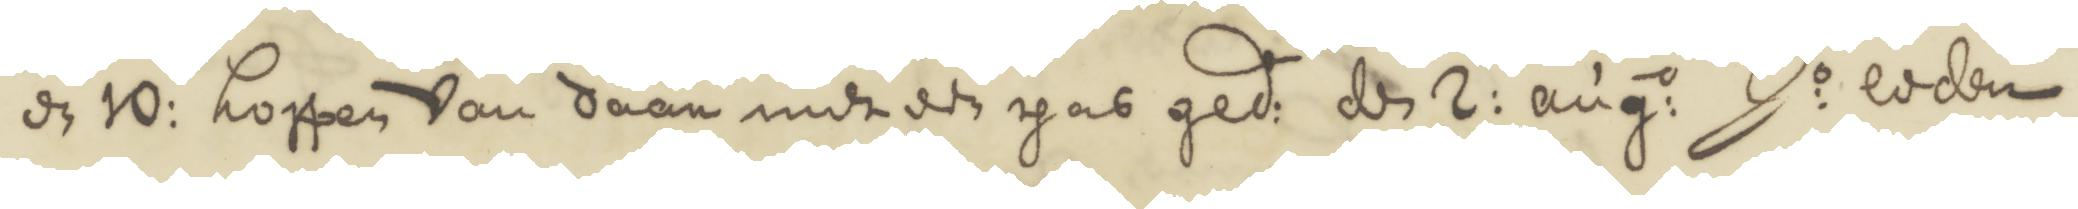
en 10: koppen van daar met een pas ged:t den 2: aug:o J:o leden
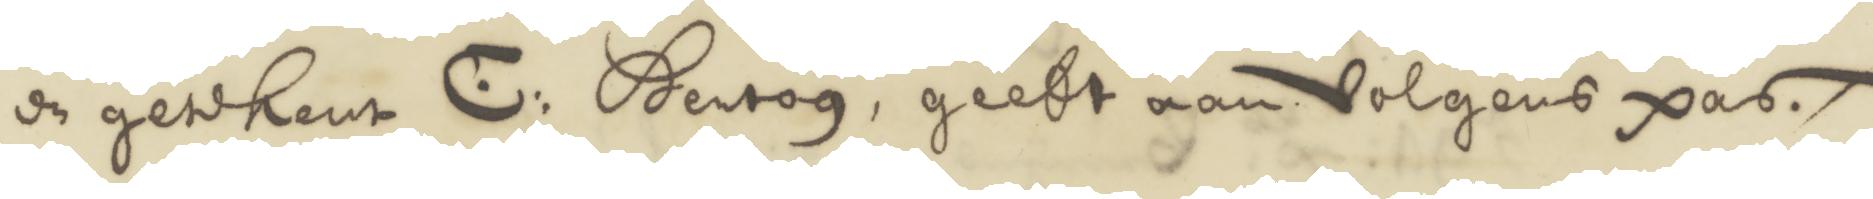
en getekent C: Hertog, geeft aan volgens pas.
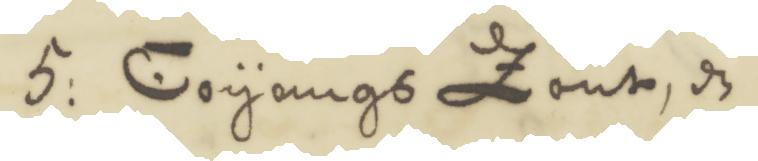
5: Coijangs zout, en
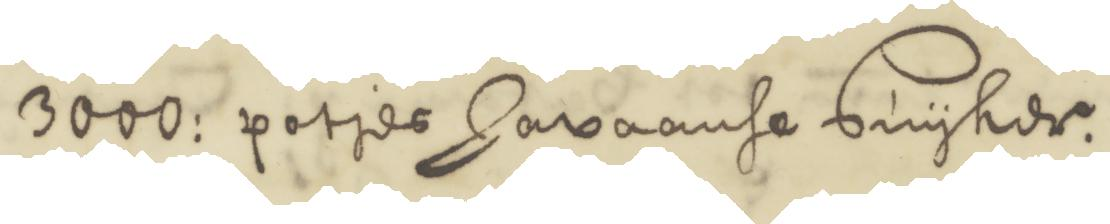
3000: potjes Javaanse suijker.
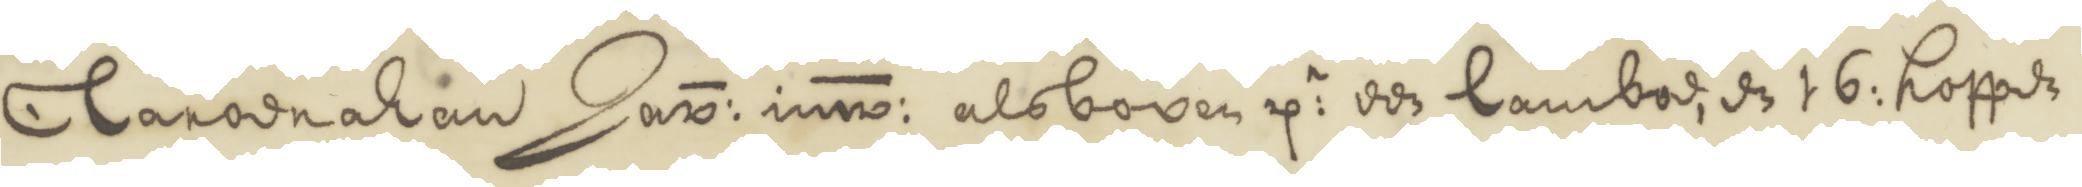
. „ . „ . Charoenahan Jav: inw: als boven p:r een lamboe, en 16: koppen
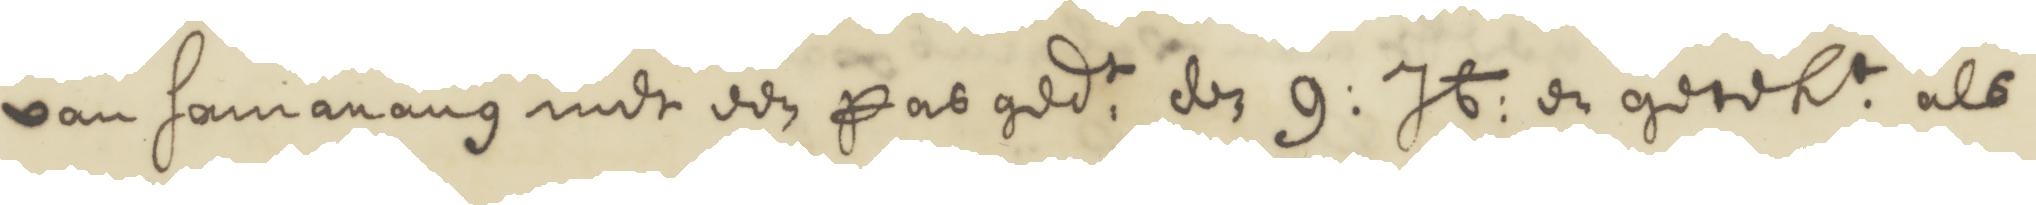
van samarang met een pas ged:t den 9: 7b: en getek.t als
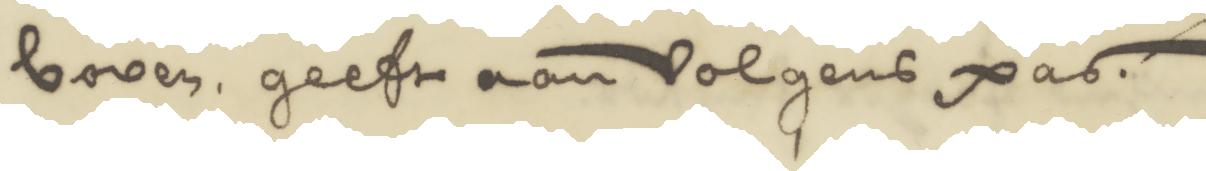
boven, geeft aan volgens pas.
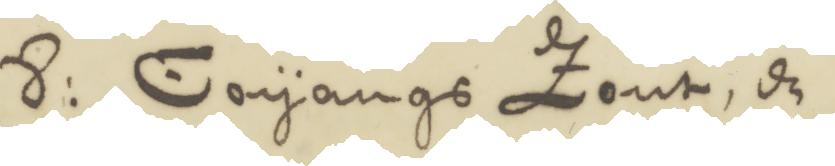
8: Coijangs zout, en
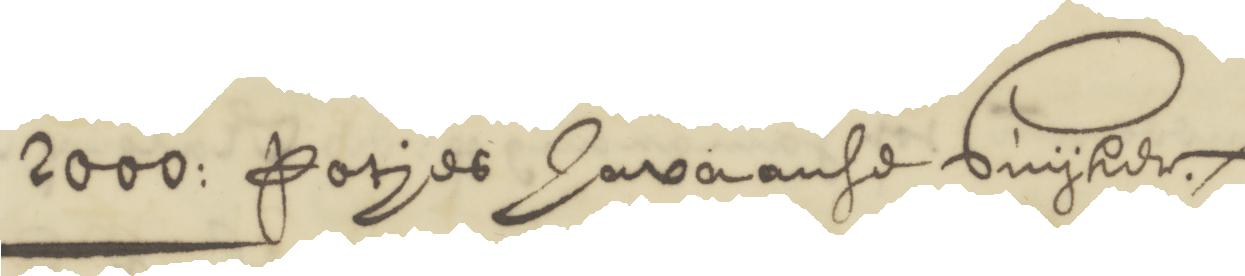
2000: potjes Javaanse suijker
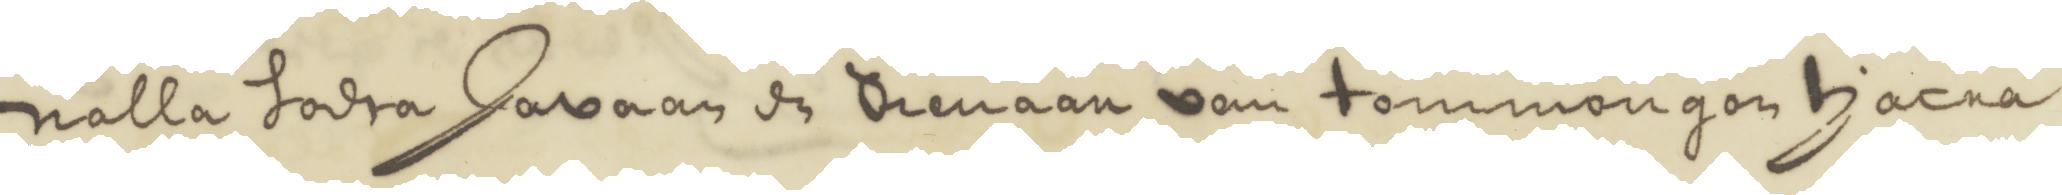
. „ . „ . nalla Soeta Javaan en dienaar van tommongon tjacra
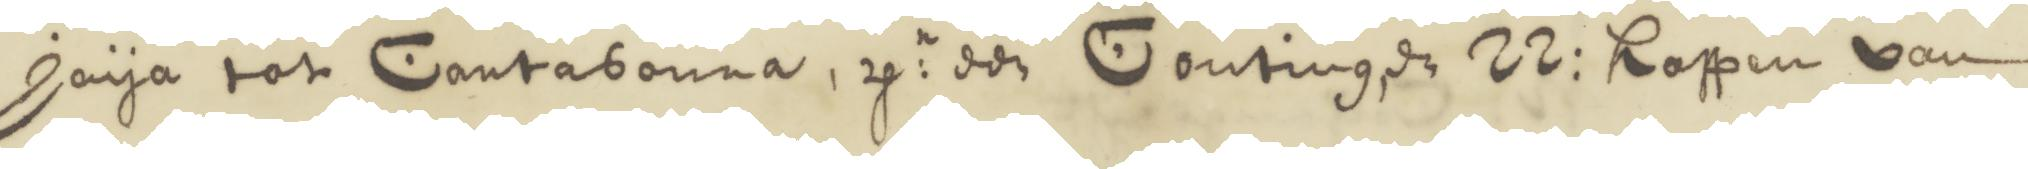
jaija tot Cartasoura, p:r een Conting, en 22: koppen van
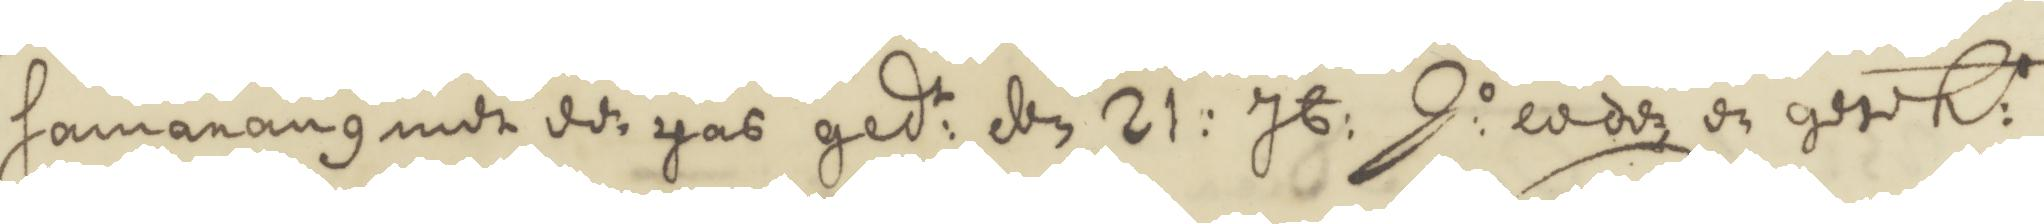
samarang met een pas ged:t den 21: 7b: J:o leden en getek:t
